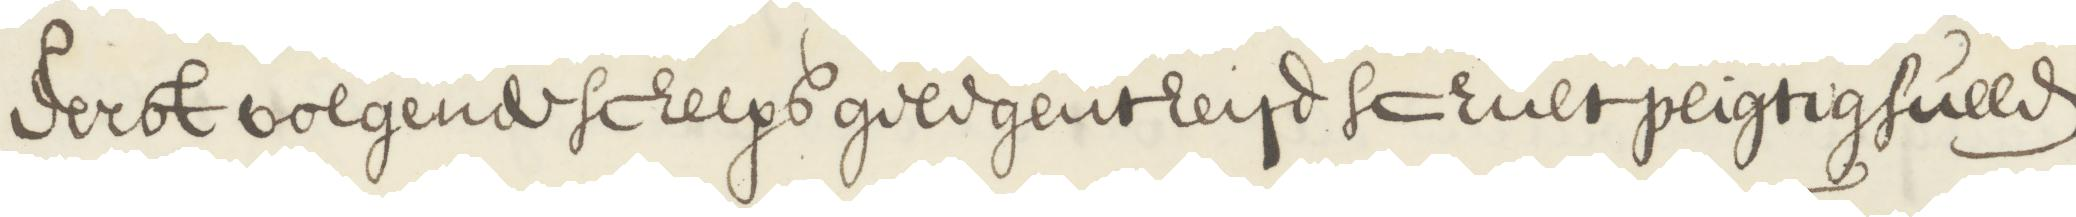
Eerst volgende scheeps gelegentheijd schultpligtig sullen
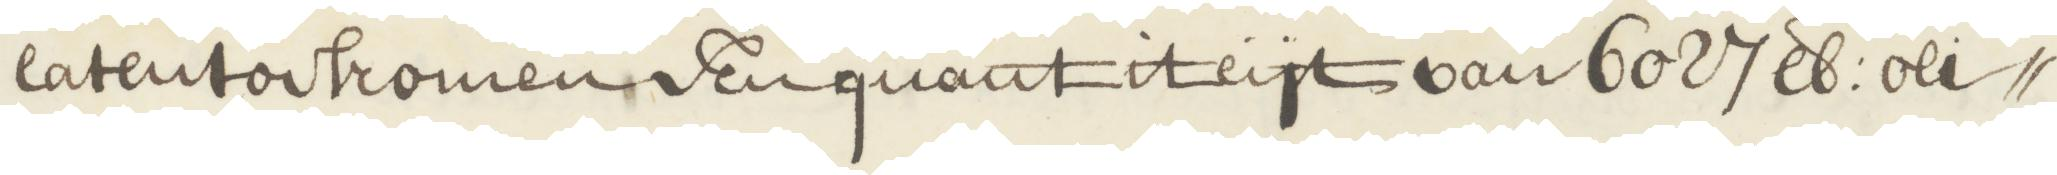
laten toekomen Een quantiteijt van 6027 lb: oli„
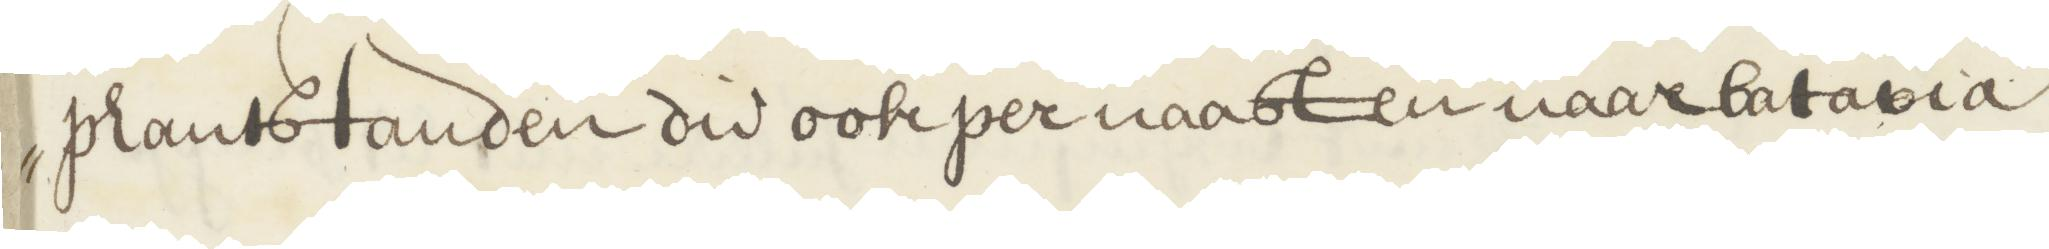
phantstanden die ook per naasten naar batavia
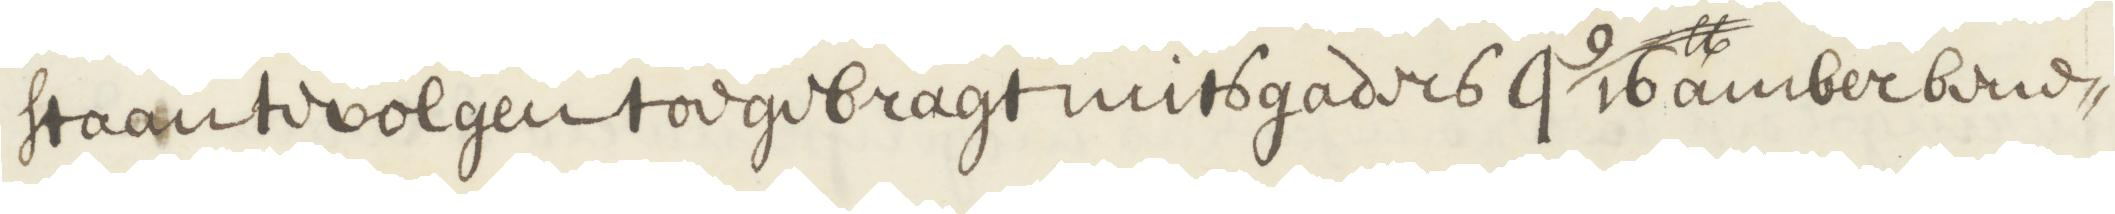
staan tevolgen toegebragt mitsgaders 4 9/16lb amber bene„
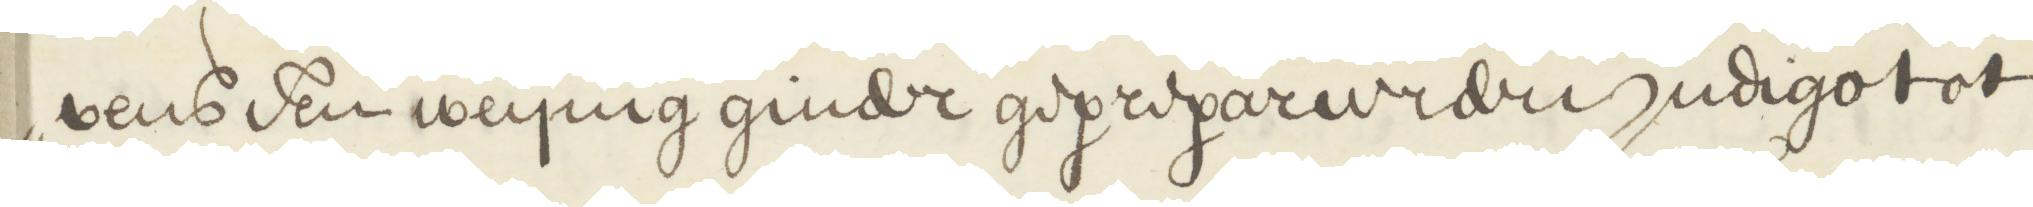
„vens Een weijnig ginder geprepareerden jndigo tot
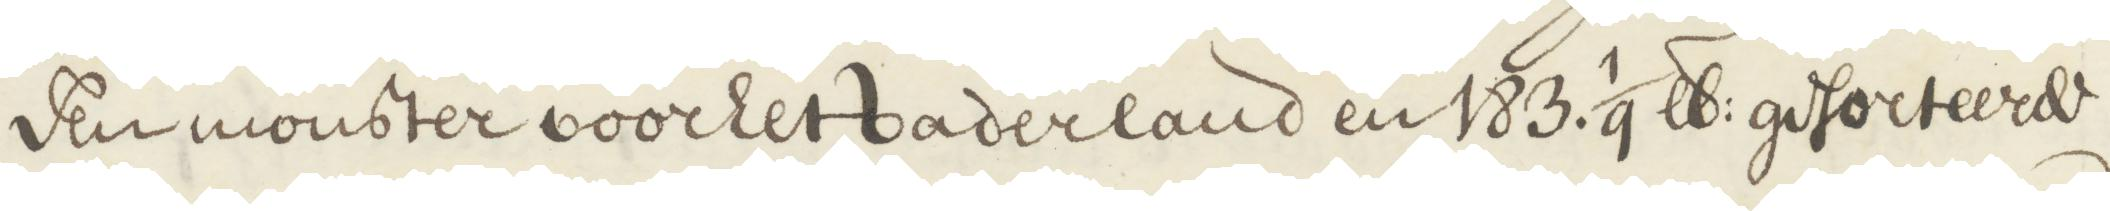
Een monster voor het vaderland en 183.¼lb: gesorteerde
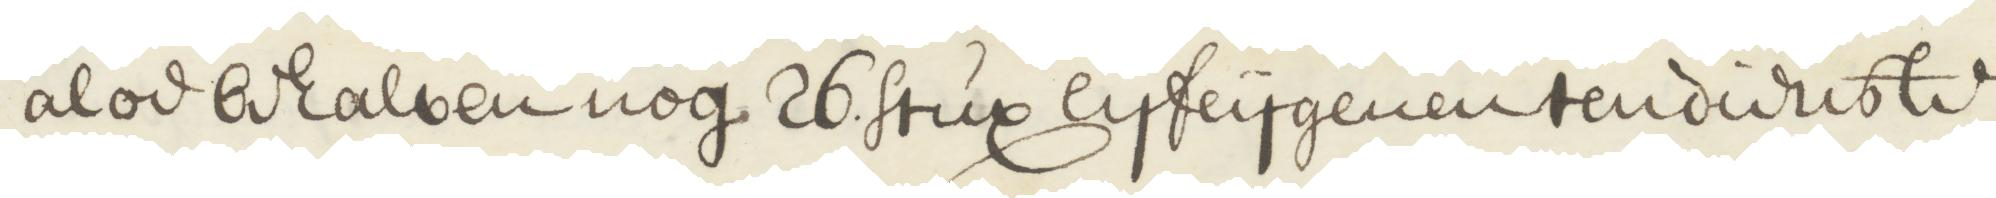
aloe behalven nog 26. stux lijfeijgenen ten dienste
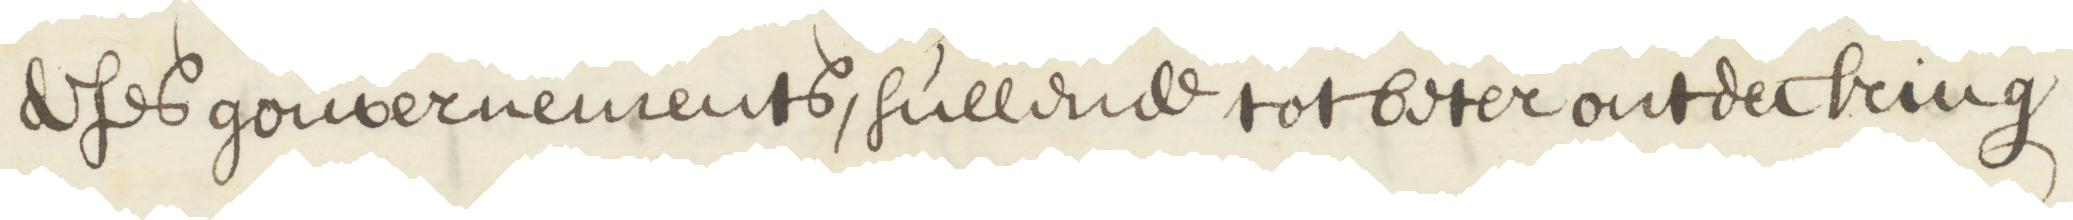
deses gouvernements, sullende tot beter ontdecking
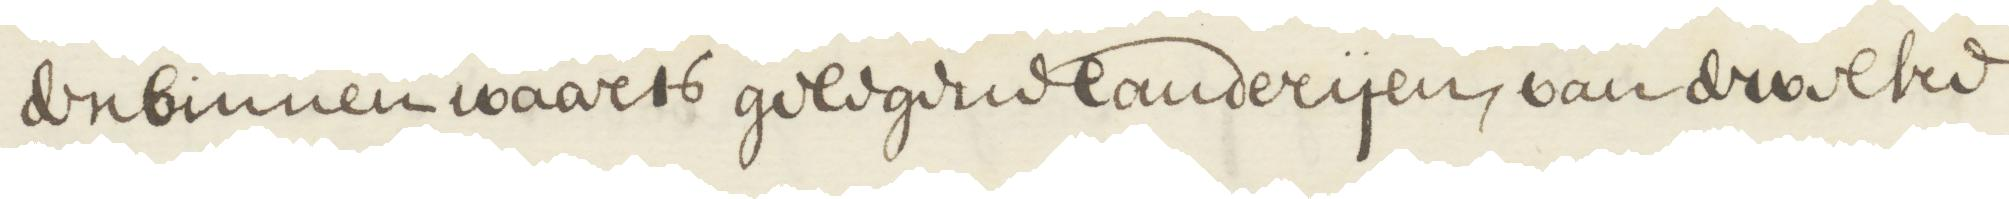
den binnen waarts gelegene landerijen, van dewelke
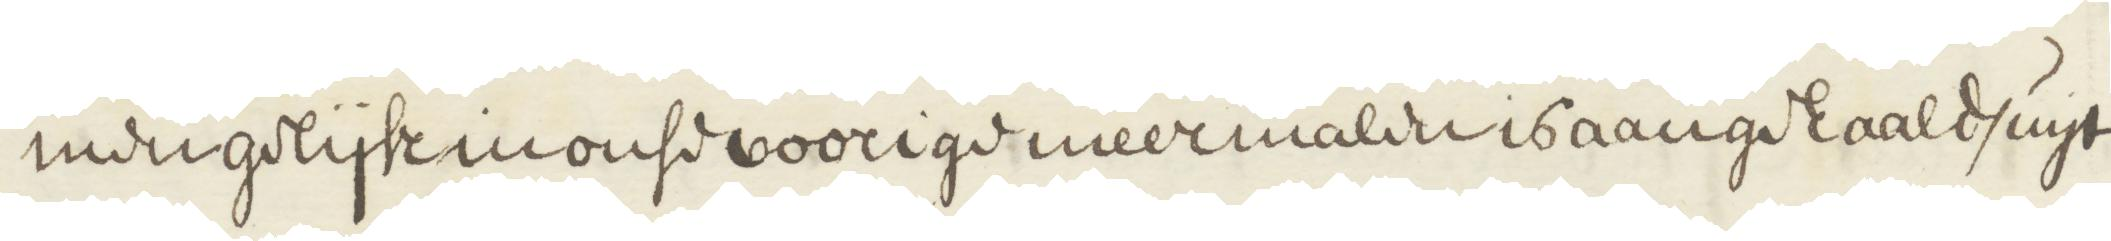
men gelijk in onse voorige meermalen is aangehaald/uijt
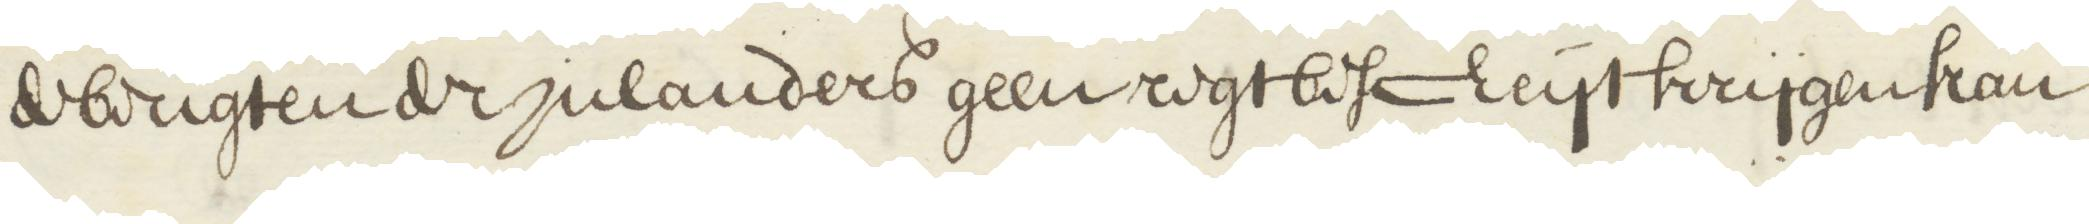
de berigten der jnlanders geen regtbescheijt krijgen kan
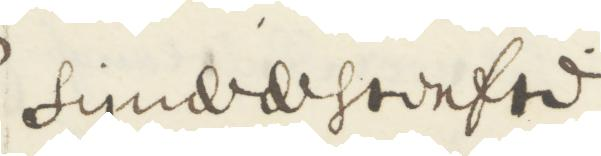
sijnde de sterfte
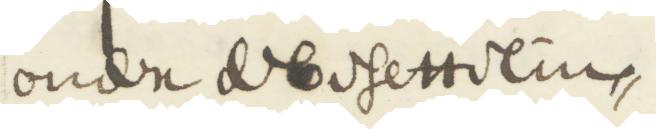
onder de besettelin„
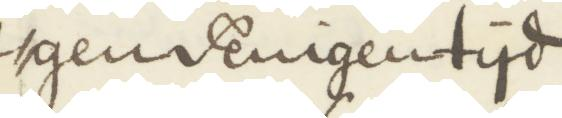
„gen Eenigen tijd
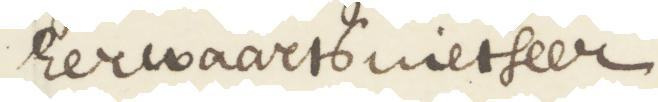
herwaarts niet seer
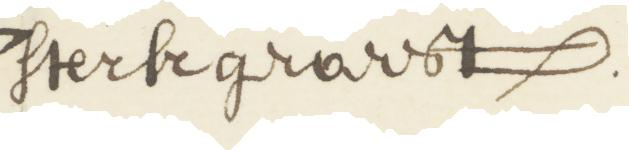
sterk geweest
